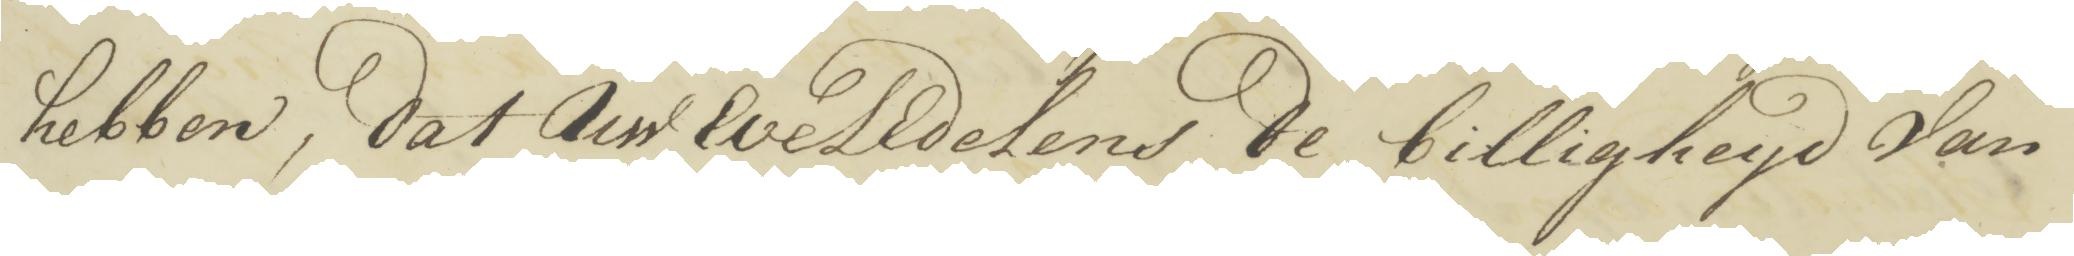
hebben, dat uw welEdelens de billigheyd van
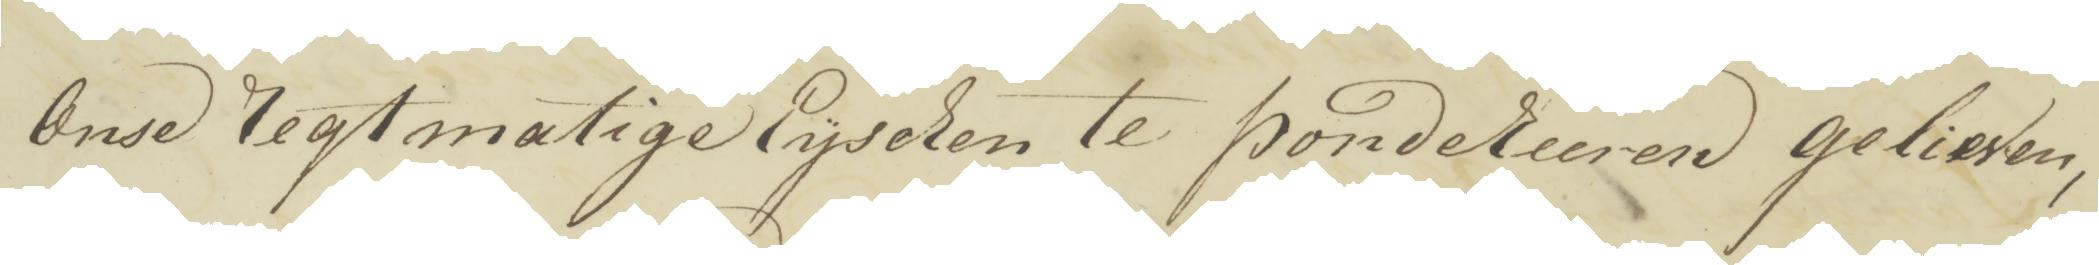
onse regtmatige Eijschen te pondereeren gelieven,
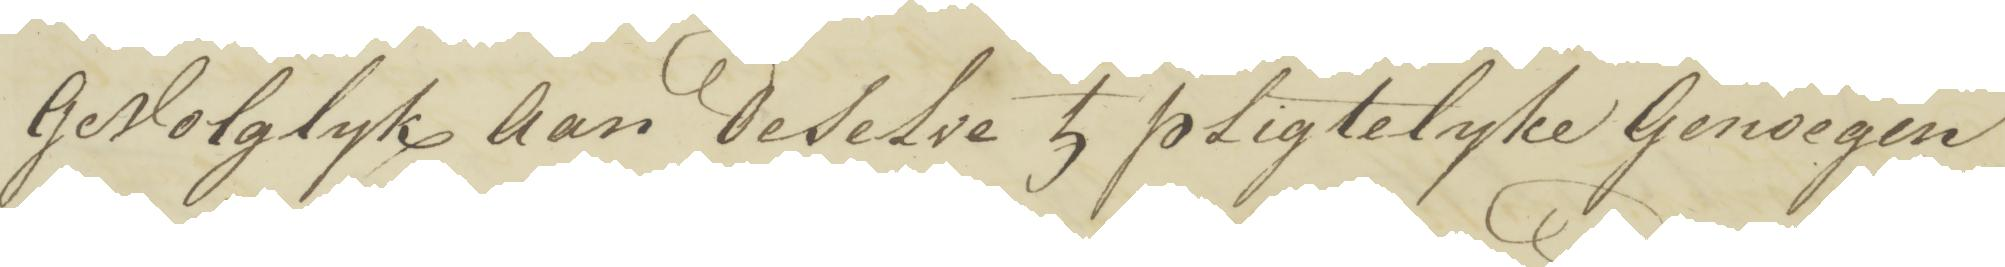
gevolglyk aan deselve 't pligtelyke genoegen
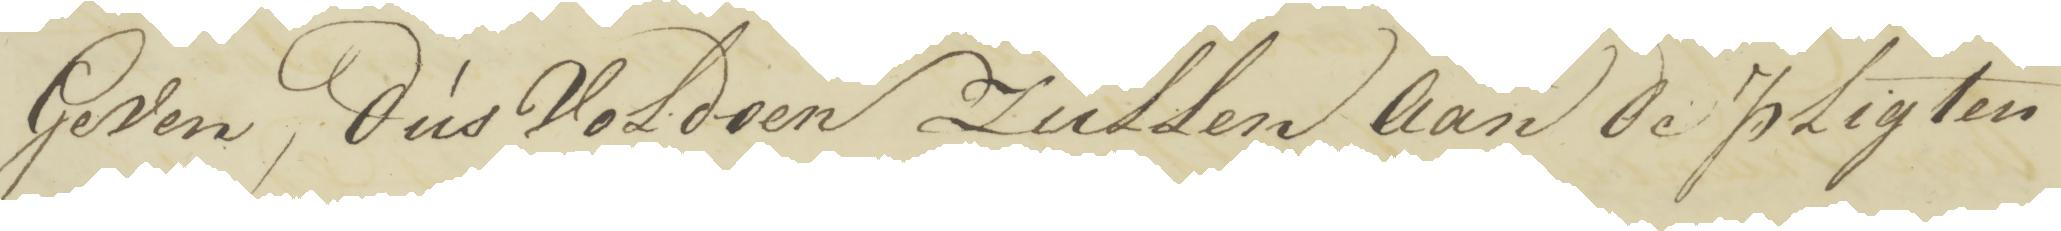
Geven, dus voldoen zullen aan de pligten
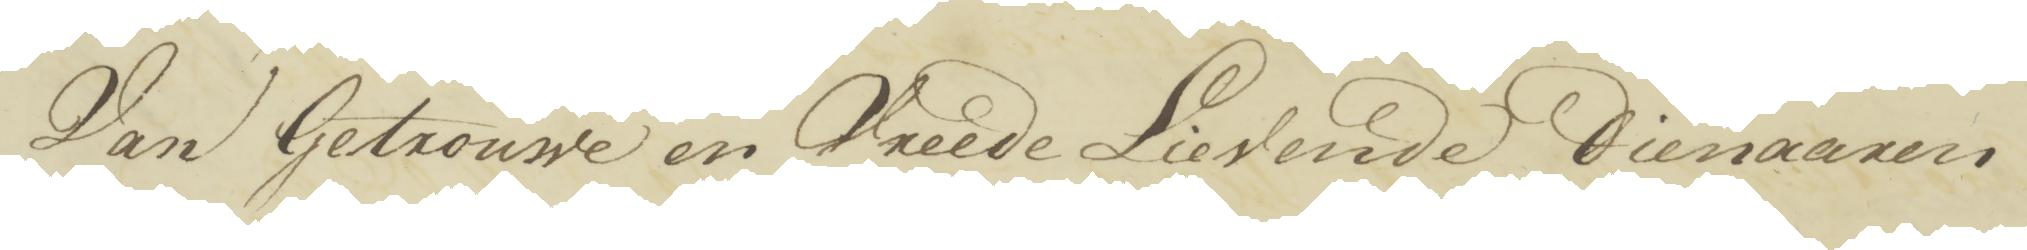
van Getrouwe en vreede Lievende dienaaren
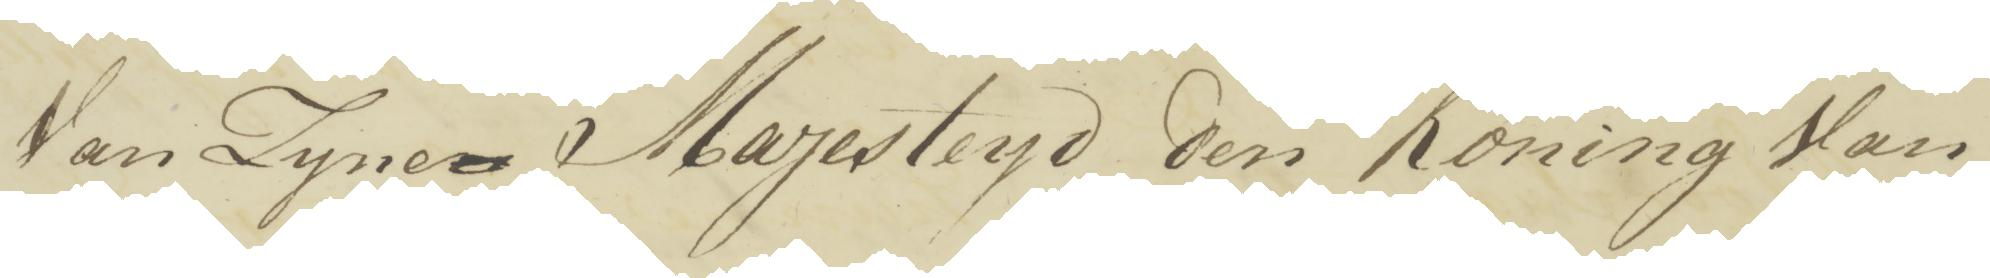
van zynen Majesteyd den Koning van
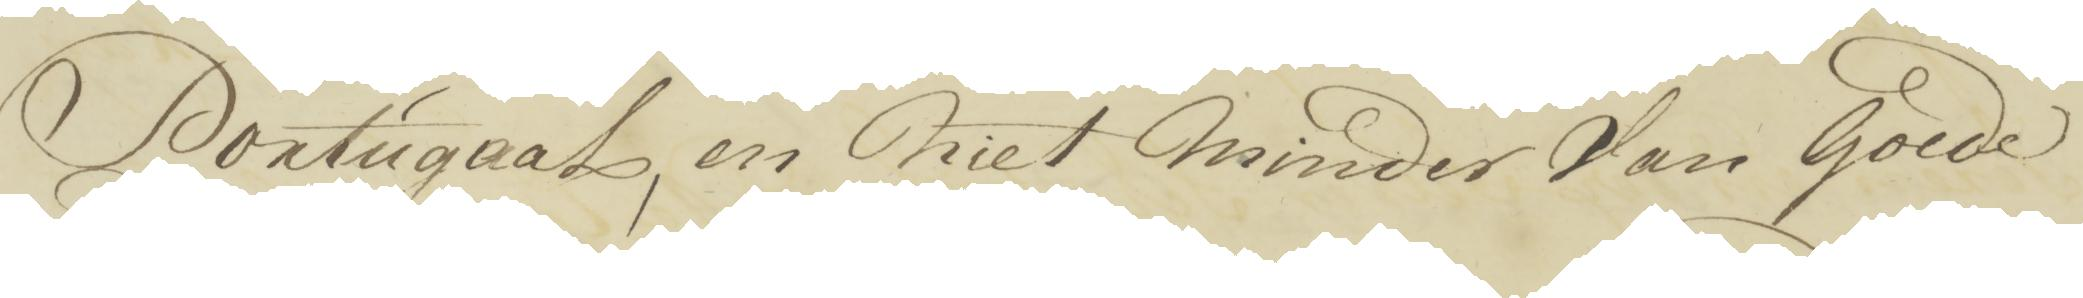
Portugaal, en niet minder van goede
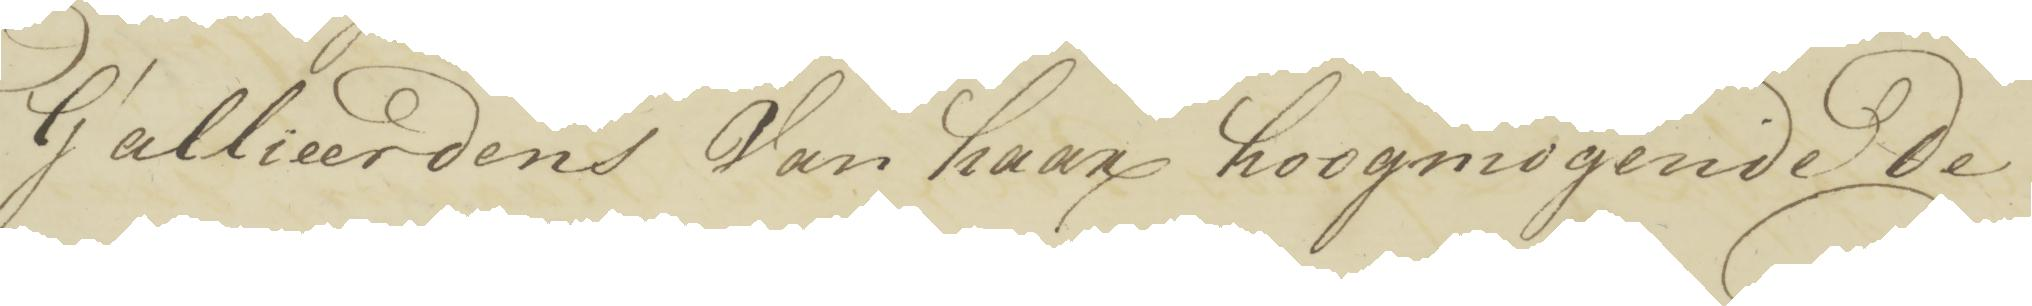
G'allieerdens van haar hoogmogende de
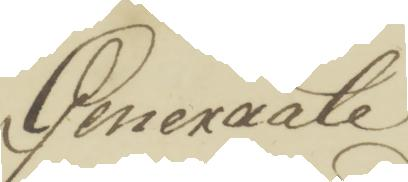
Generaale
